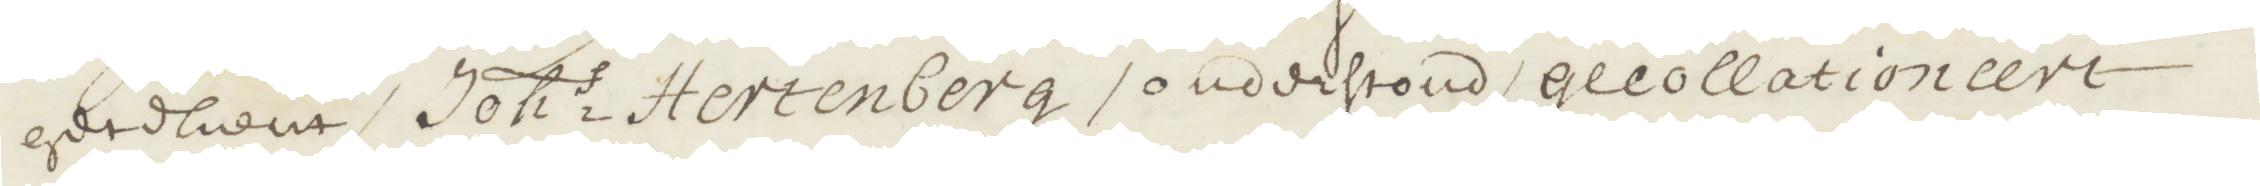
getekent/ Ioh=s Hertenberg /onderstond/ gecollationeert —
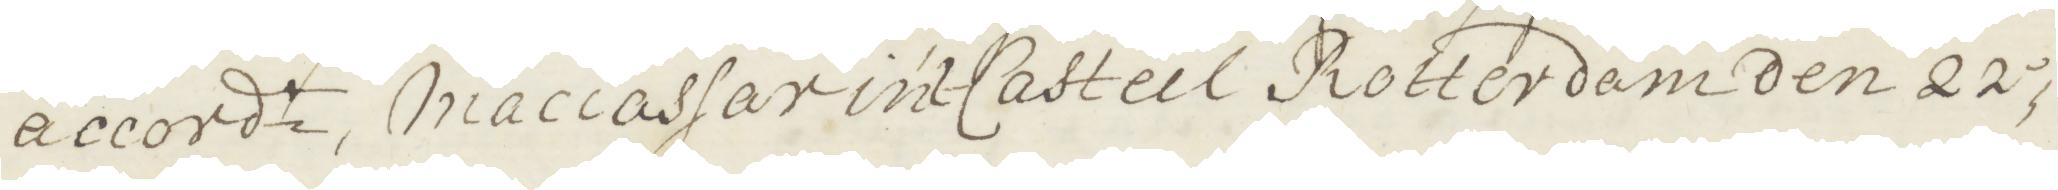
accord=t, maccassar in't Casteel Rotterdam den 22„e
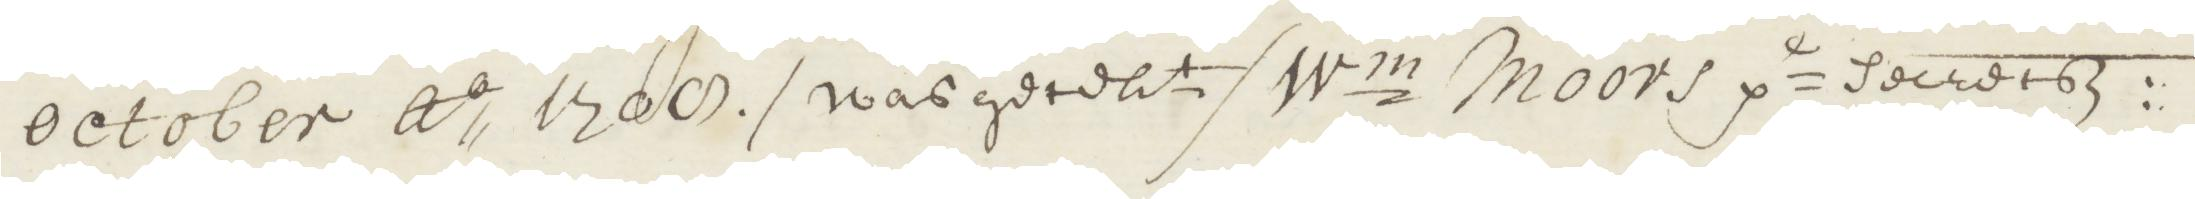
october a„o 1708. /was getek-t/ W=m Moors p=' secrets:
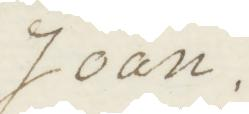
Joan.
